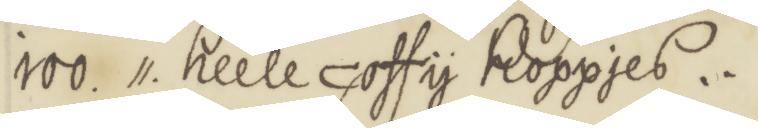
100. „. heele coffij koppjes . -
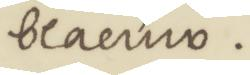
blaeuw.
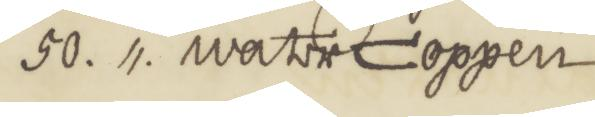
50. „. water coppen
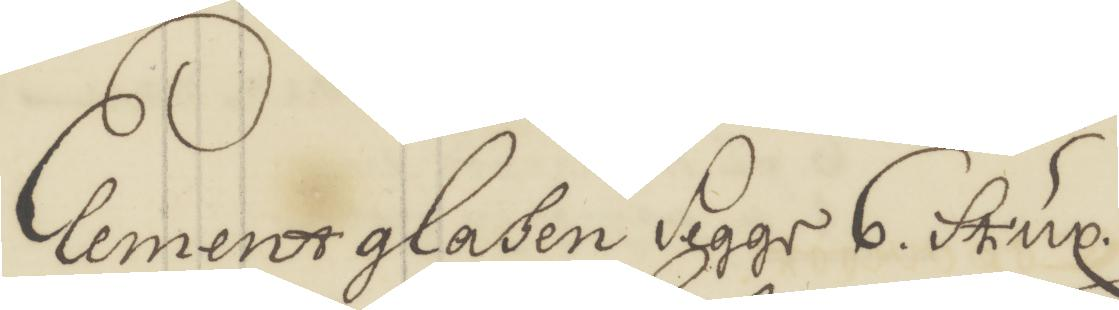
Clement glasen segge 6: stux.
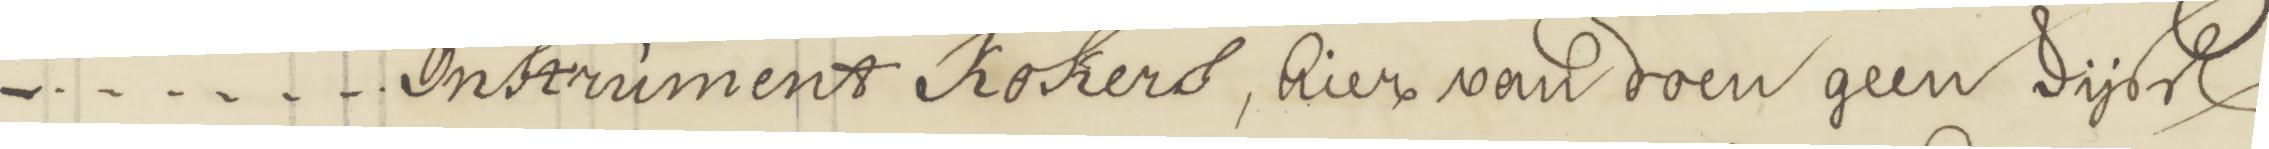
. - - - - - . Instrument kokers, hier van doen geen Eijsch,
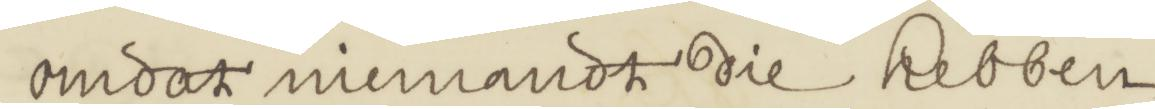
omdat niemandt die hebben
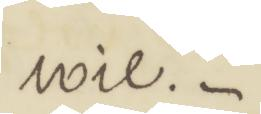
wil.
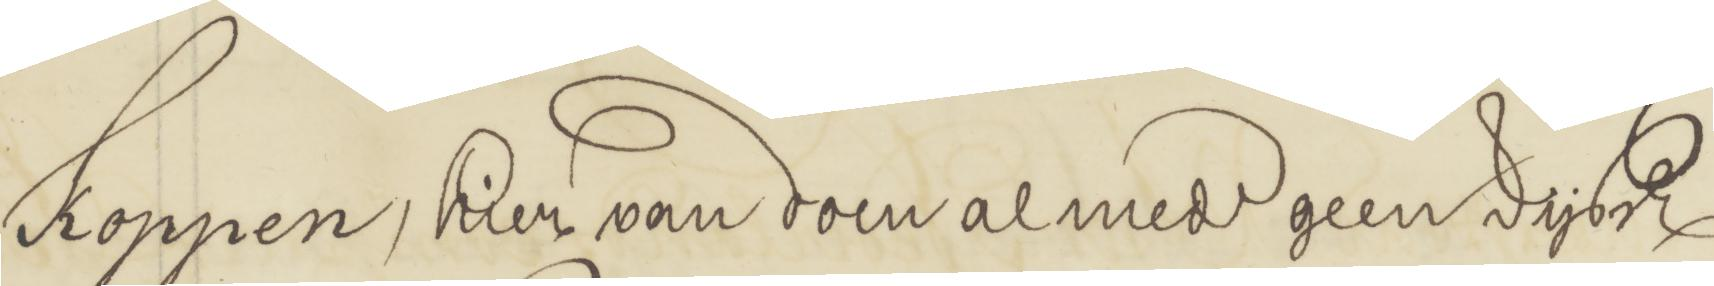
koppen, hier van doen al mede geen eijsch.
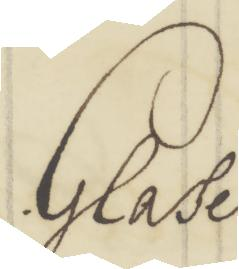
Glase
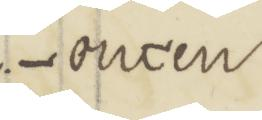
– oncen
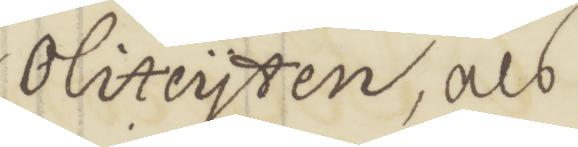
Oliteijten, als
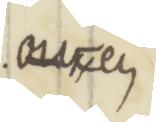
oncen
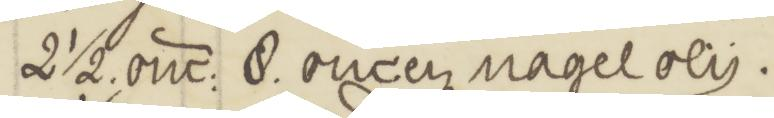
2½. onc: 8. oncen nagel olij.
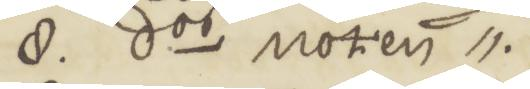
8. d-os noten „.
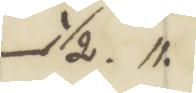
_½. „.
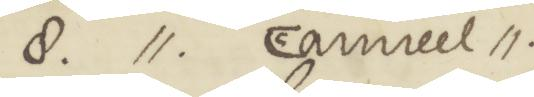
8. „. canneel „.
